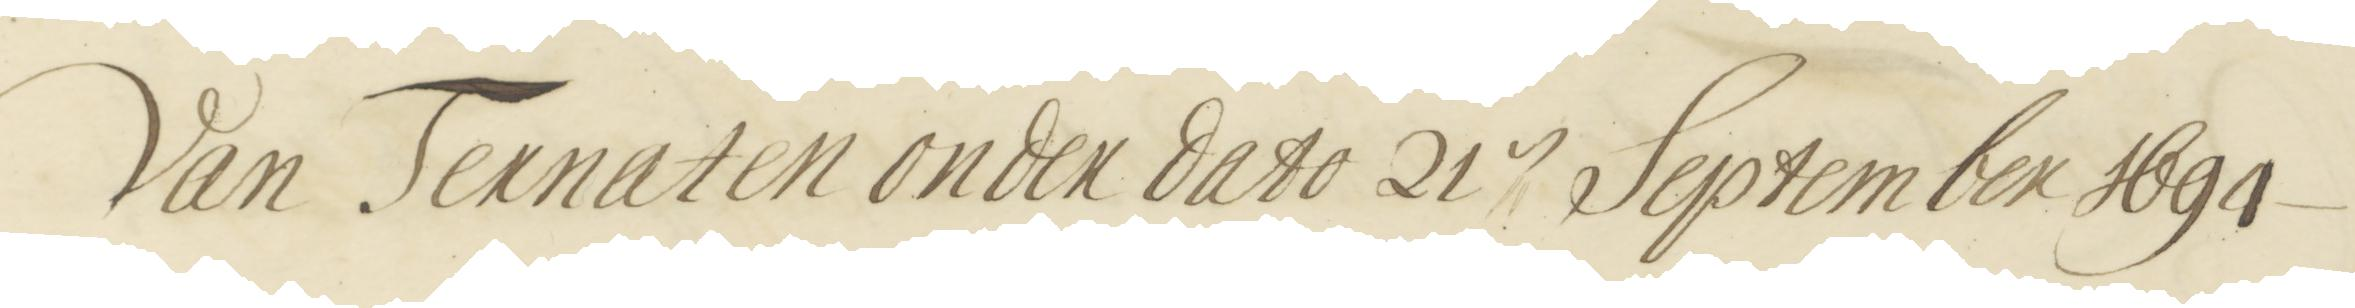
Van Ternaten onder dato 21„en September 1694 —
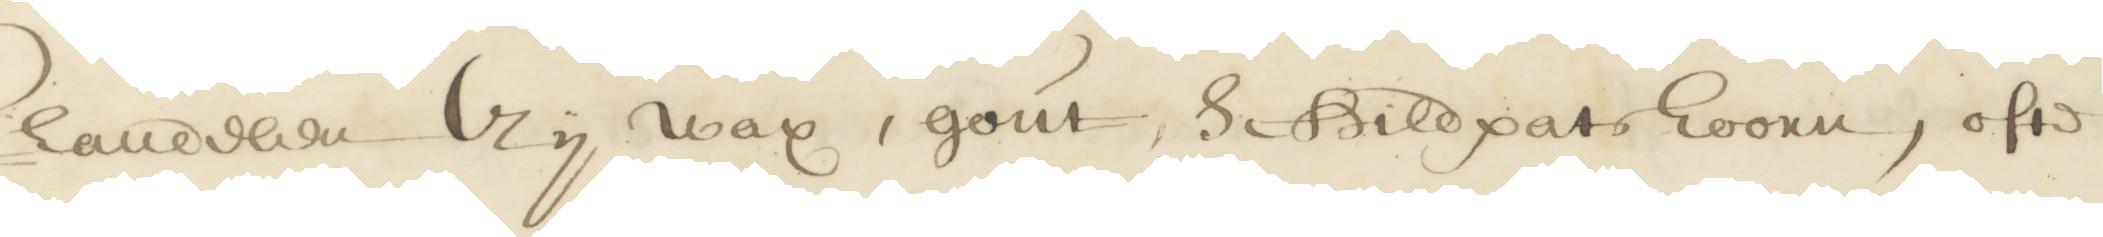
handelen 'tzij wax, gout, schildpatshoorn, ofte
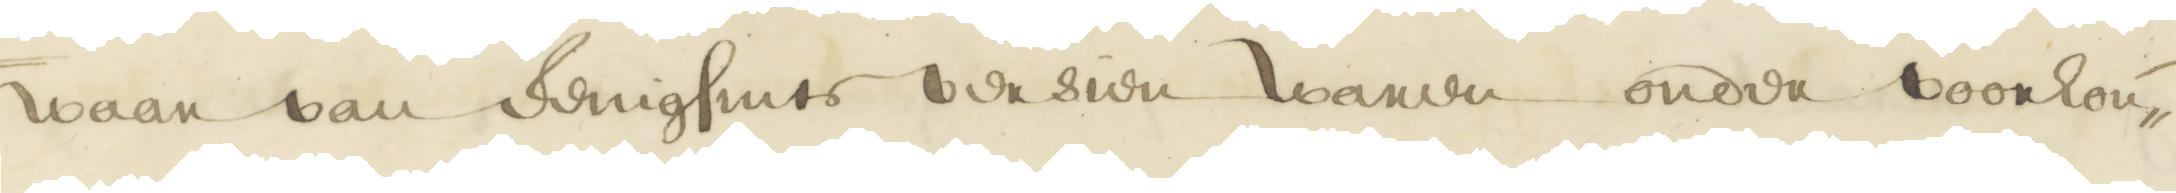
waar van Eenigsints versien waren onder voorhou„
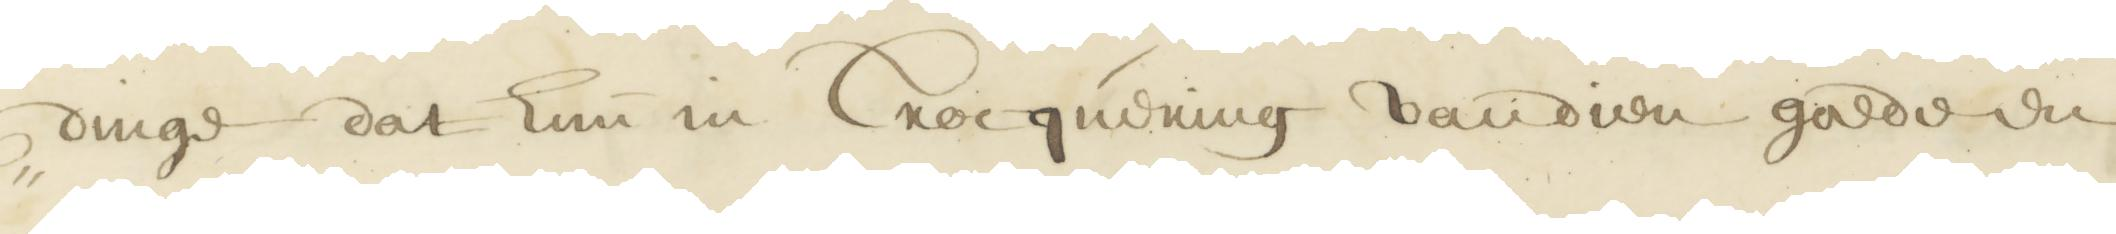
„dinge dat hun in Trocquering van dien goede en
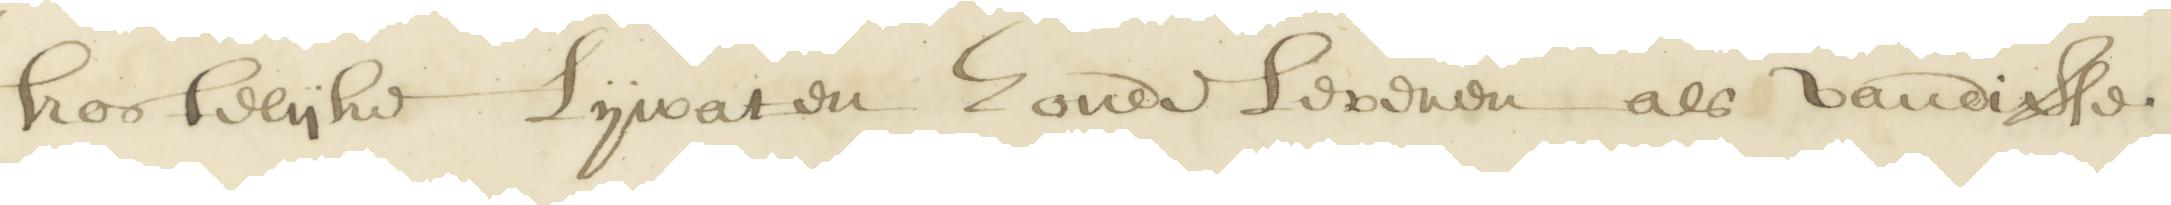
kostelijke lijwaten zoude leveren als van diverse
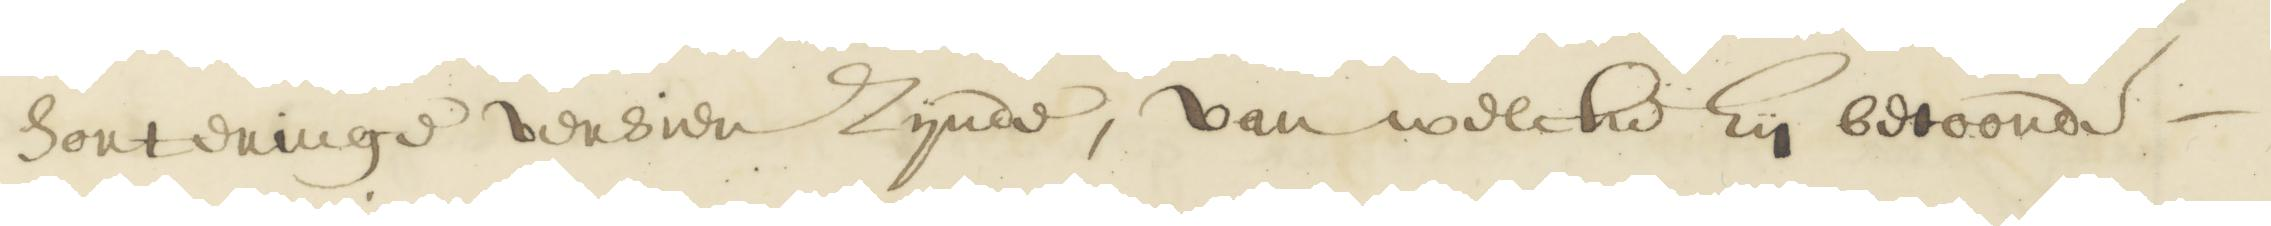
sorteringe versien zijnde, van welcke hij betoonde —
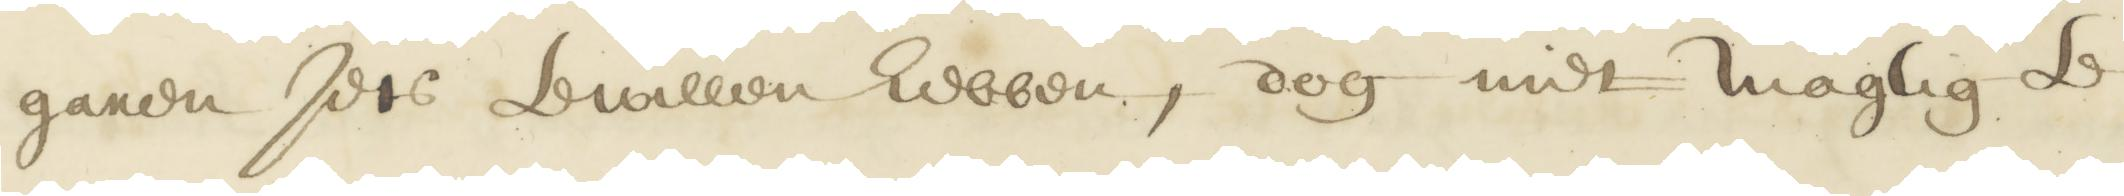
garen Jets tewillen hebben, dog niet magtig te
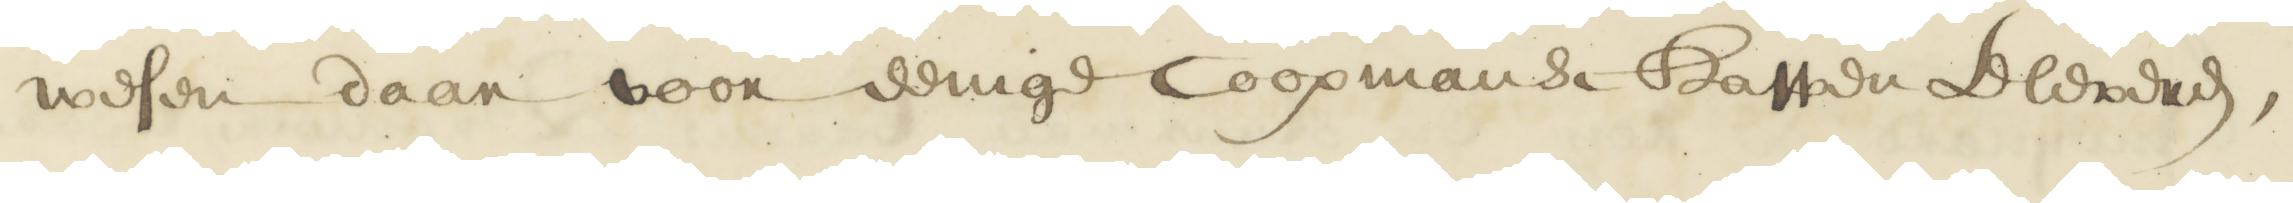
wesen daar voor eenige coopmanschappen te leveren,
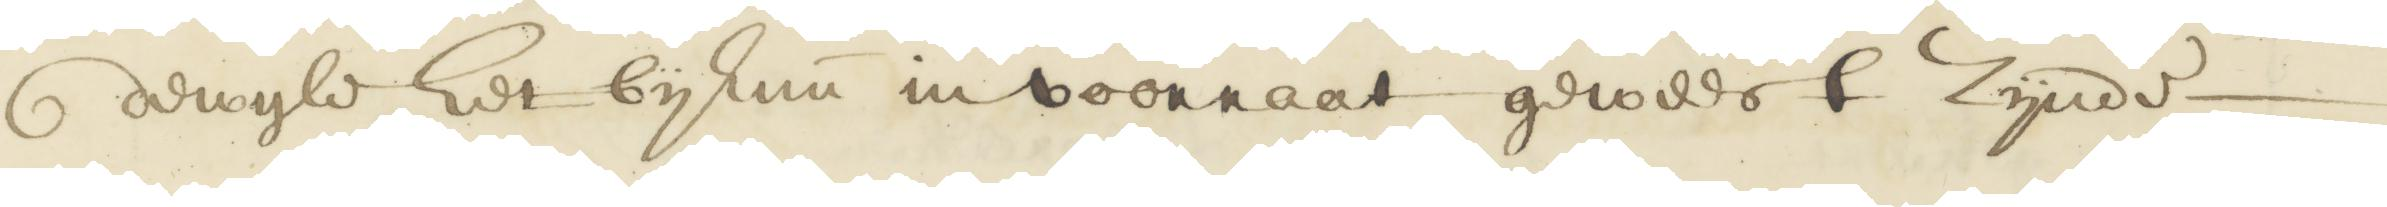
dewyle het bij hun in voorraat geweest zijnde —
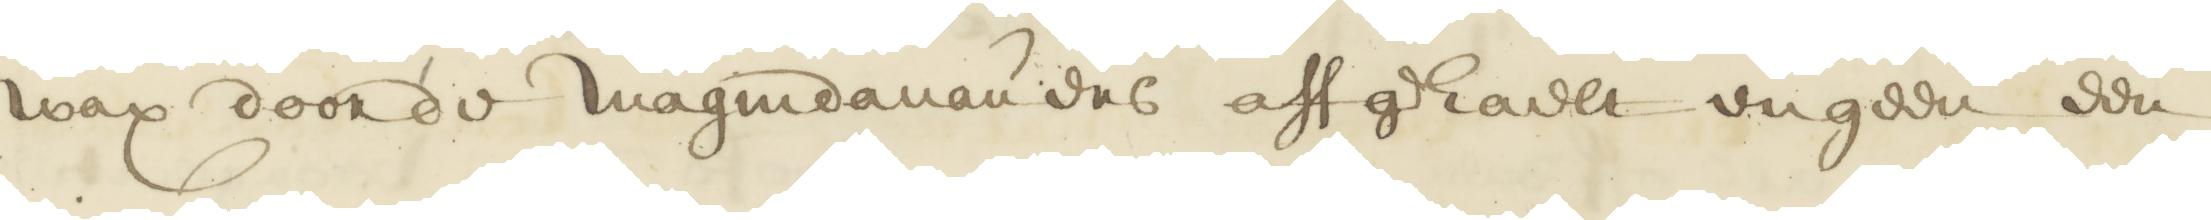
wax door de magindanauers affgehaelt en geen een
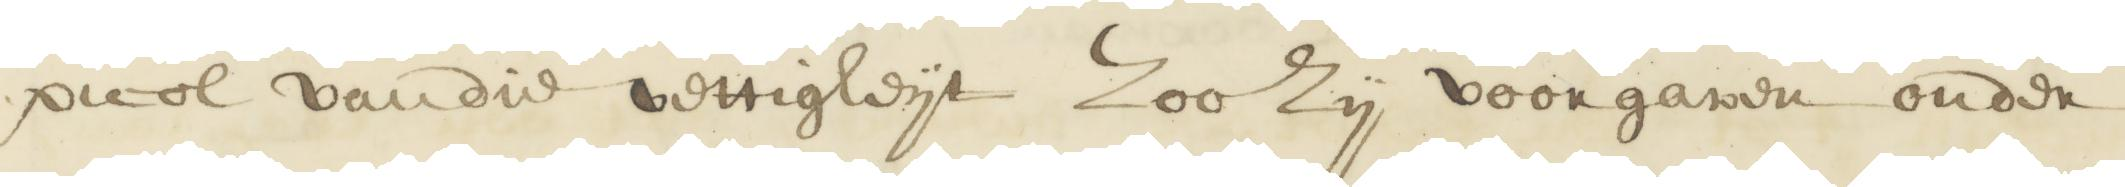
picol vandie vettigheijt zoo zij voorgaven onder
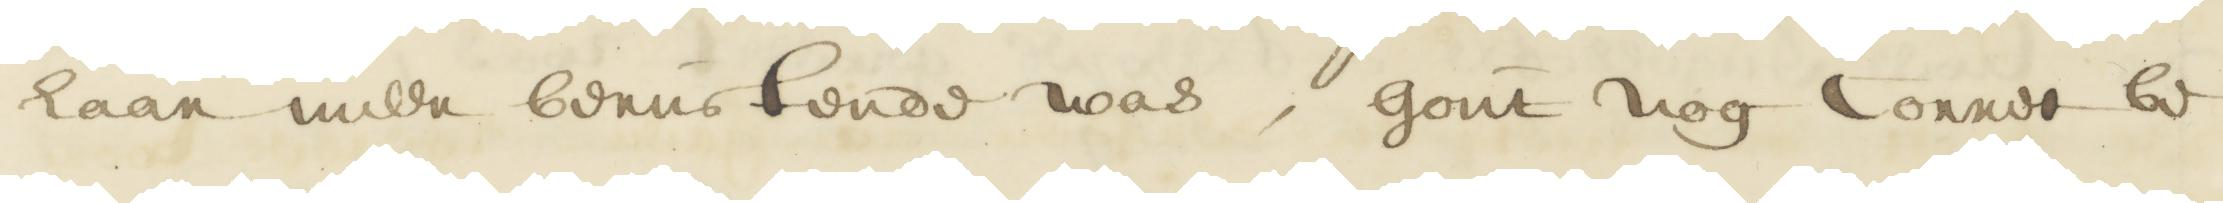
haar meer berustende was, gout nog Corret be
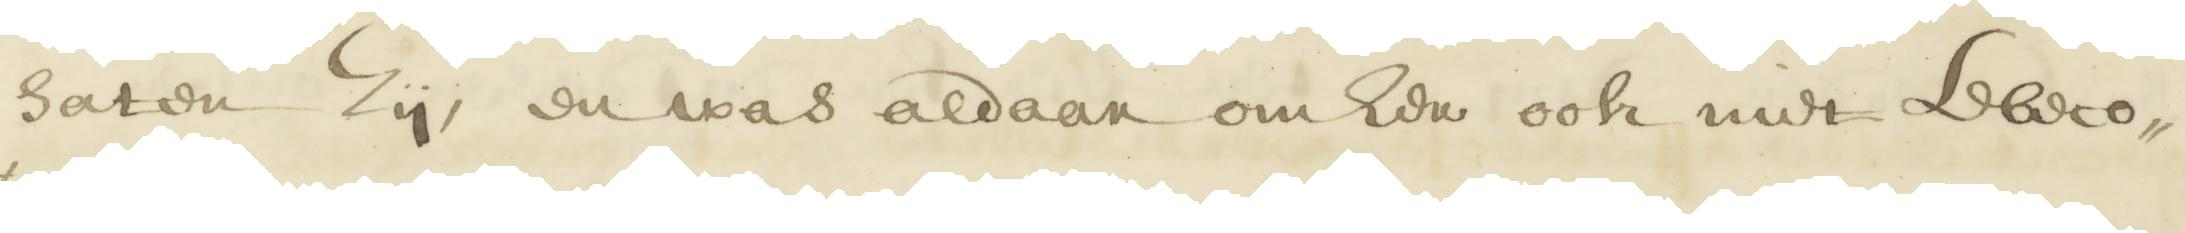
saten zij, en was aldaar om her ook niet te beco„
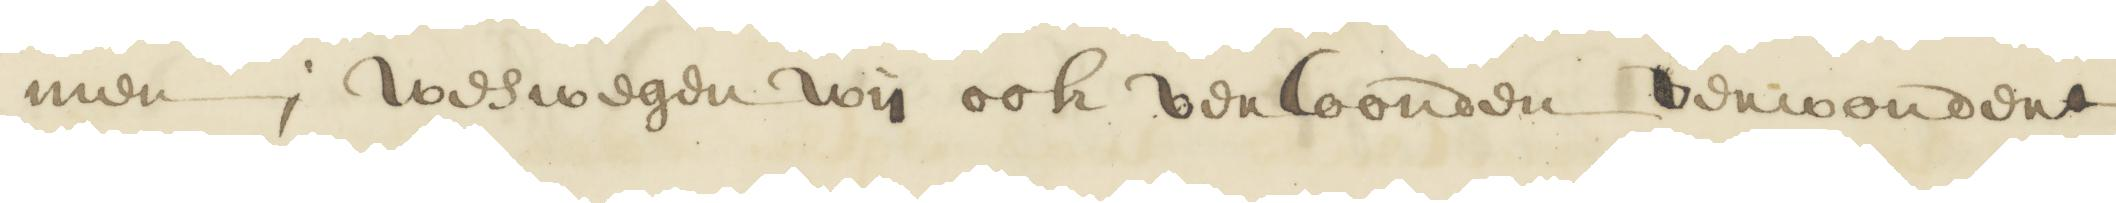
men; weswegen wij ook vertoonden verwondert
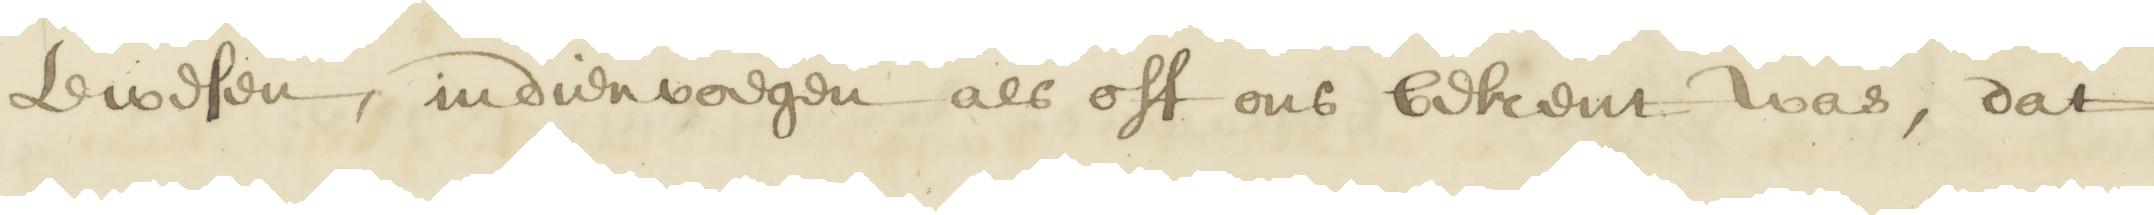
te wesen, in diervoegen als off ons bekent was, dat
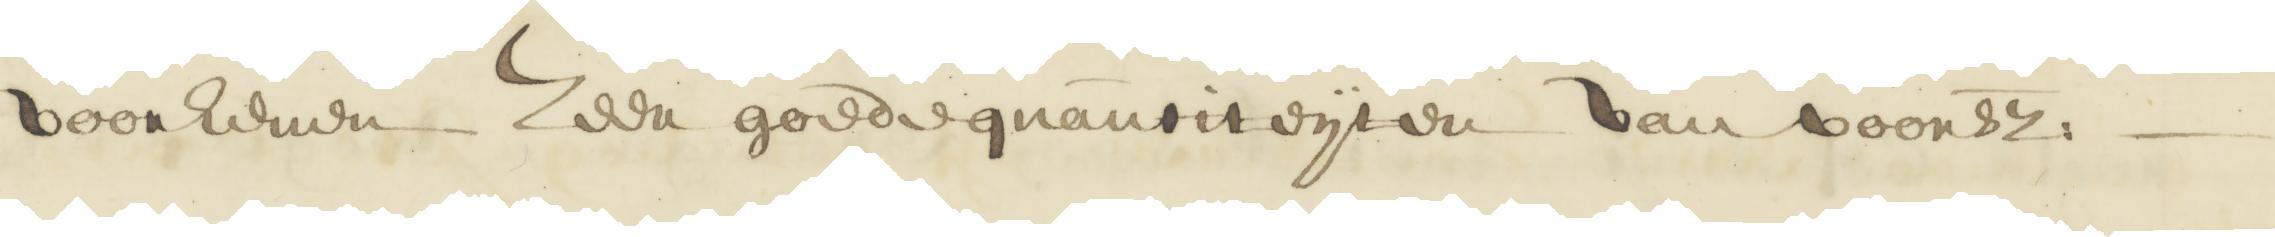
voorhenen zeer goede quantiteijten van voorsz: —
